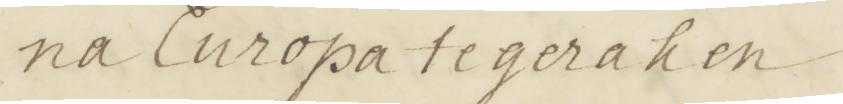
na Europa te geraken
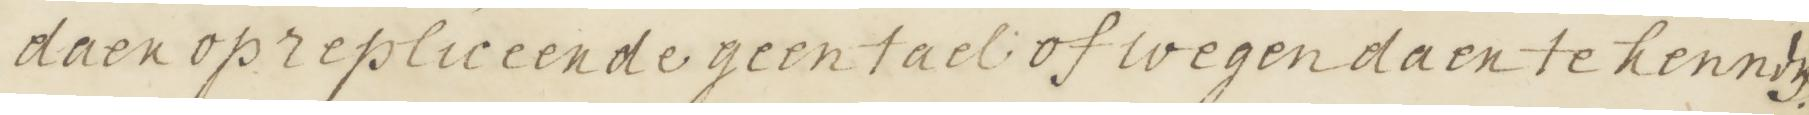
daer op repliceerde geen tael of wegen daer te kennen.
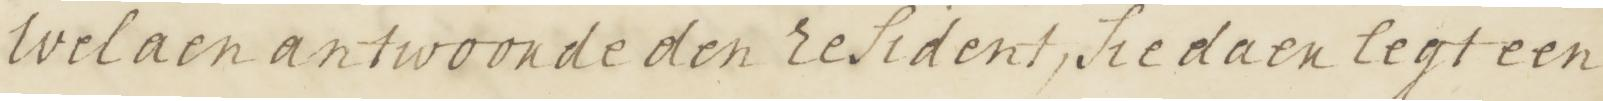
wel aen antwoorde den resident, sie daer legt een
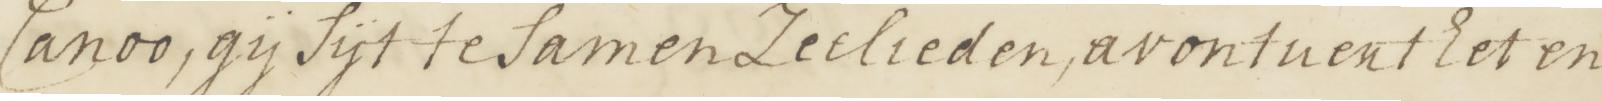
canoo, gij sijt te samen zeelieden, avontuert het en
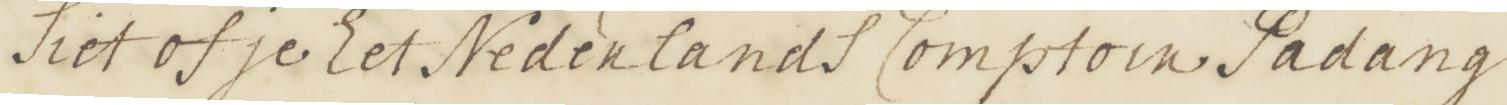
siet of je het Nederlands comptoir Padang
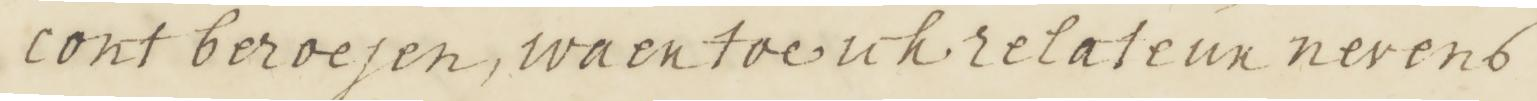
cont beroejen, waer toe ick relateur nevens
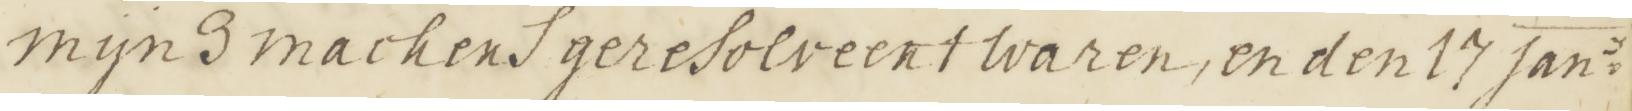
mijn 3 mackers geresolveert waren, en den 17 jan=y
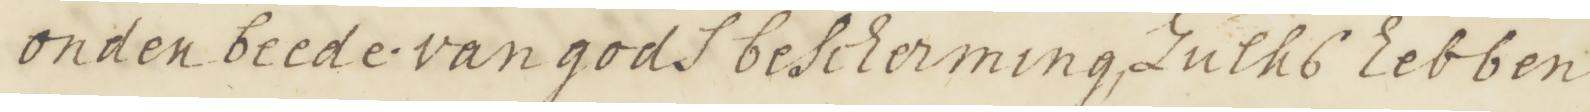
onder beede van gods bescherming, zulks hebben
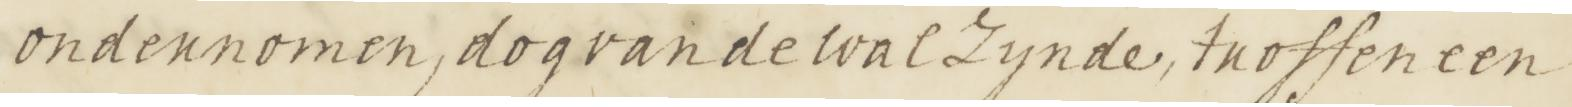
ondernomen, dog van de wal zynde, troffen een
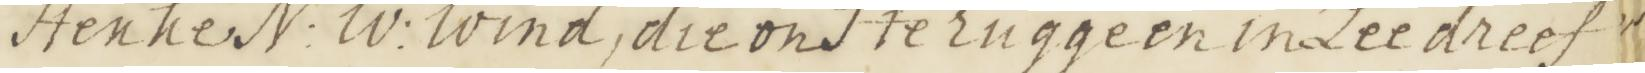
sterke N:w: wind, die ons te ruggen in zee dreef
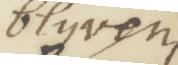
blyven
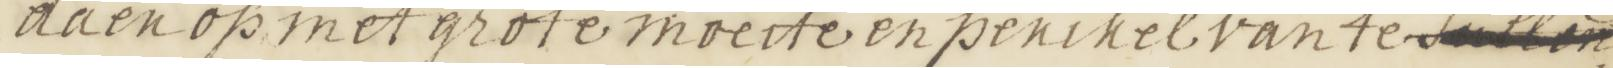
daer op wij met grote moeite en perikel van te sullen
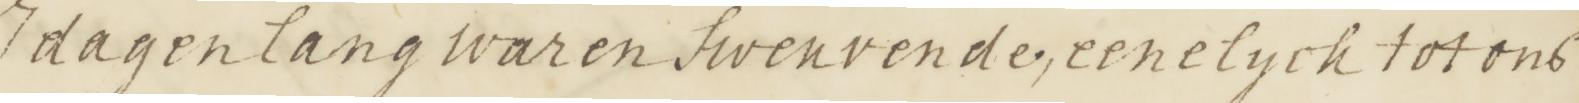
7 dagen lang waren swervende, eenelyck tot ons
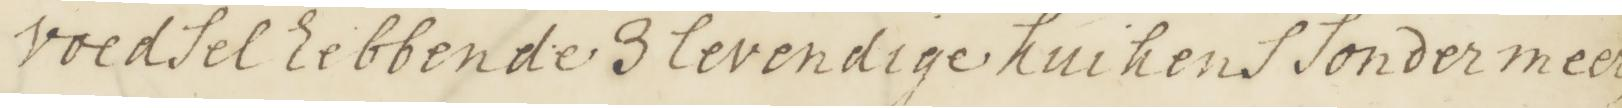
voedsel hebbende 3 levendige kuikens sonder meer
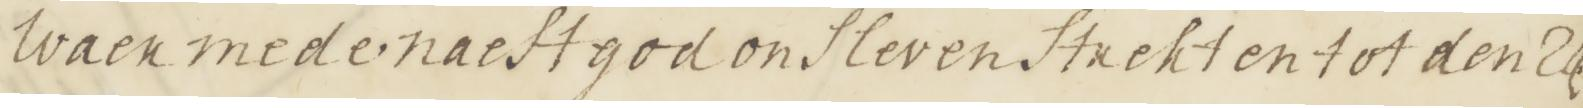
waer mede naest god ons leven strekt en tot den 24
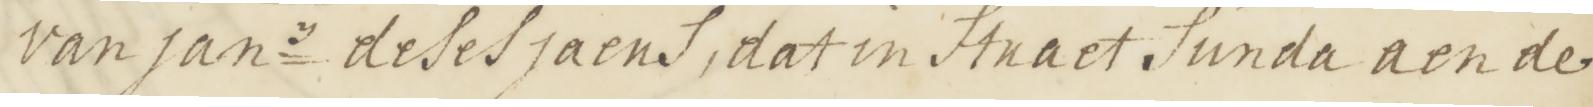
van jan=y deses jaers, dat in straet sunda aen de
